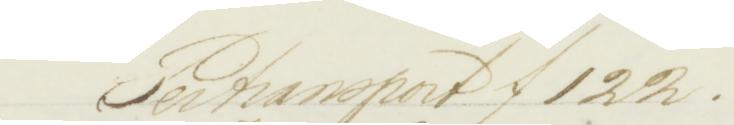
Per transport ƒ 122.
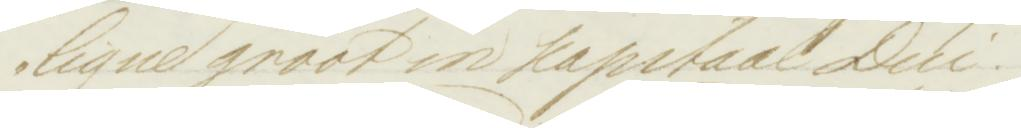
„lique groot in kapitaal Dui.
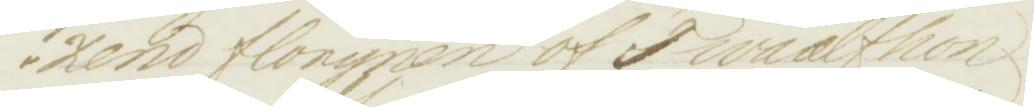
„zend florijnen of Twaalf hon
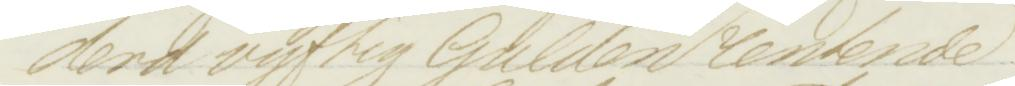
derd vyftig Gulden rentende
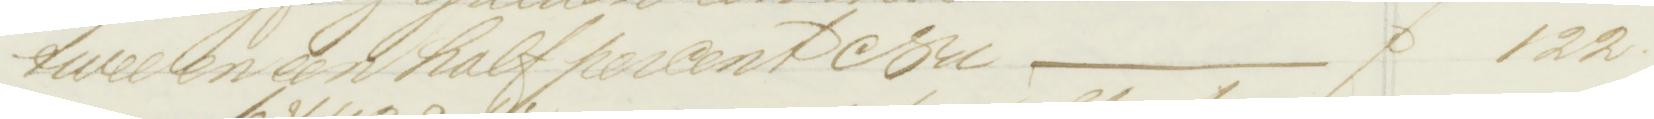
twee en een half percent Nu — ƒ 122
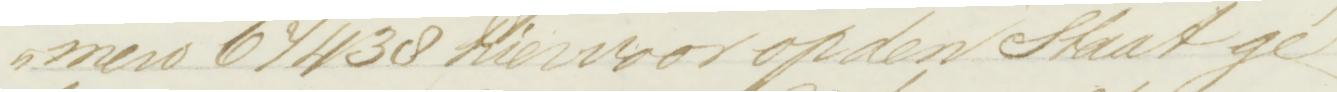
„mero 67438 hiervoor op den staat ge
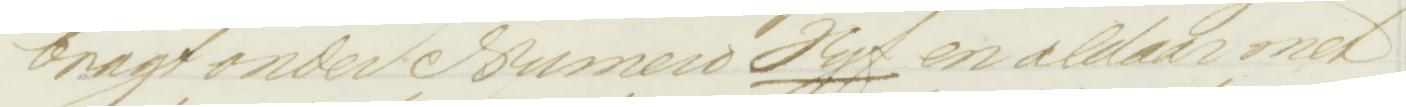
bragt onder Numero Vyf en aldaar met
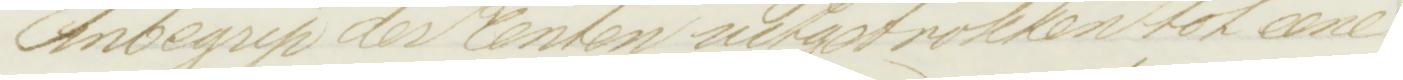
inbegrip der renten uitgetrokken tot eene
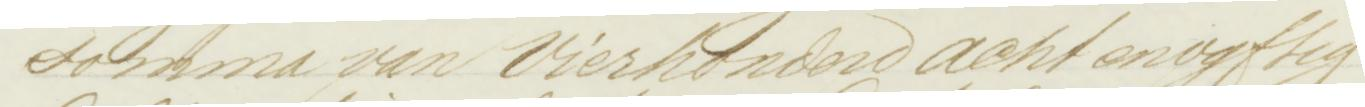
somma van Vierhonderd acht envyftig
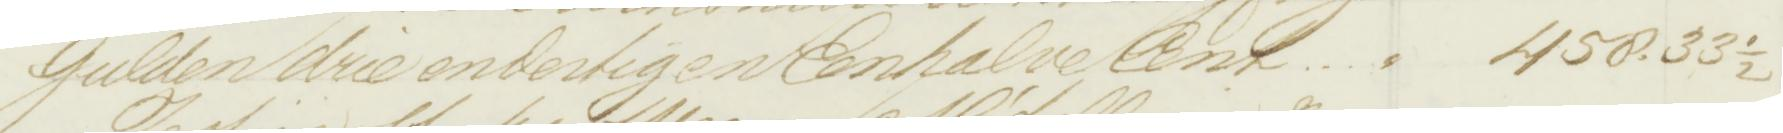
Gulden drie endertig en Een halve Cent...„ 458.33½
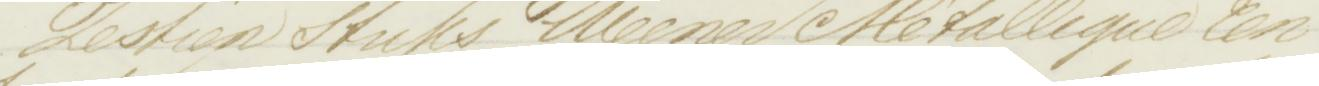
Zestien stuks Weener Metallique ren
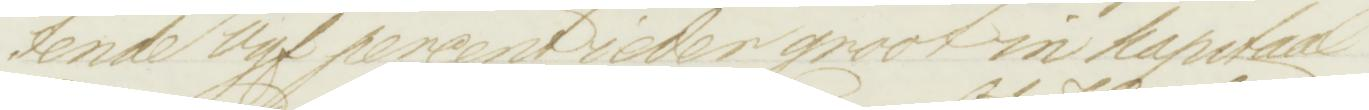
tende vyf percent ieder groot in kapitaal
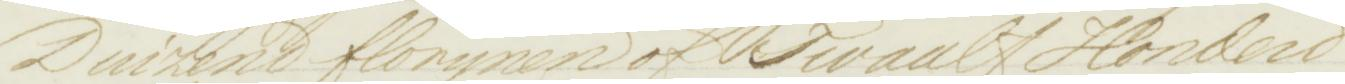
Duizend florynen of Twaalf Honderd
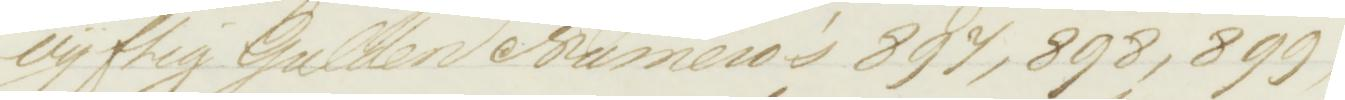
vijftig Gulden Numero's 897, 898, 899,
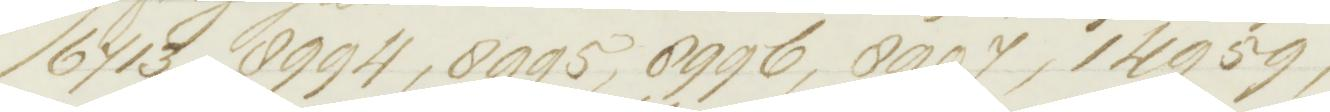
6713, 8994, 8995, 8996, 8997, 14959,
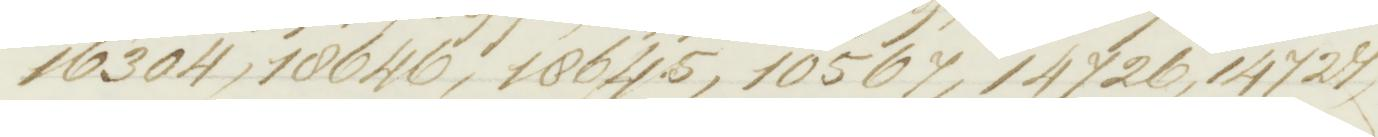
16304, 18646, 18645, 10567, 14726, 14727,
